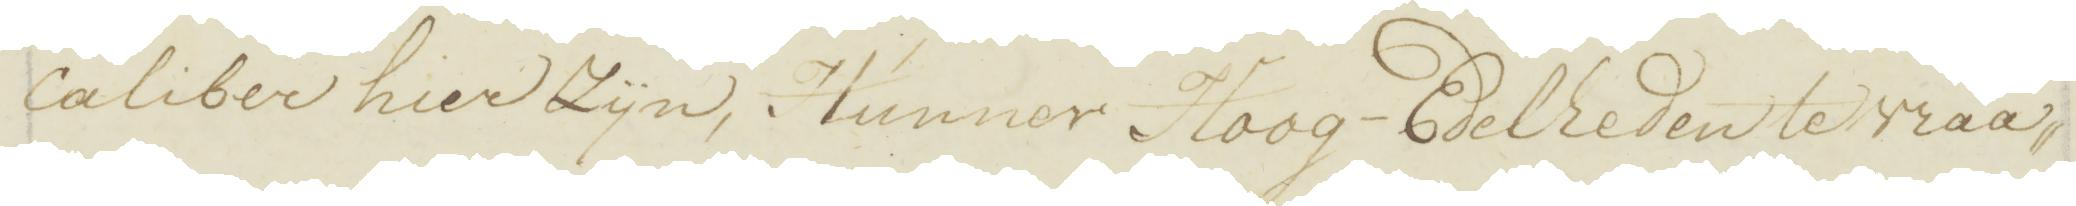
caliber hier zijn, Hunner Hoog-Edelheden te vraa„
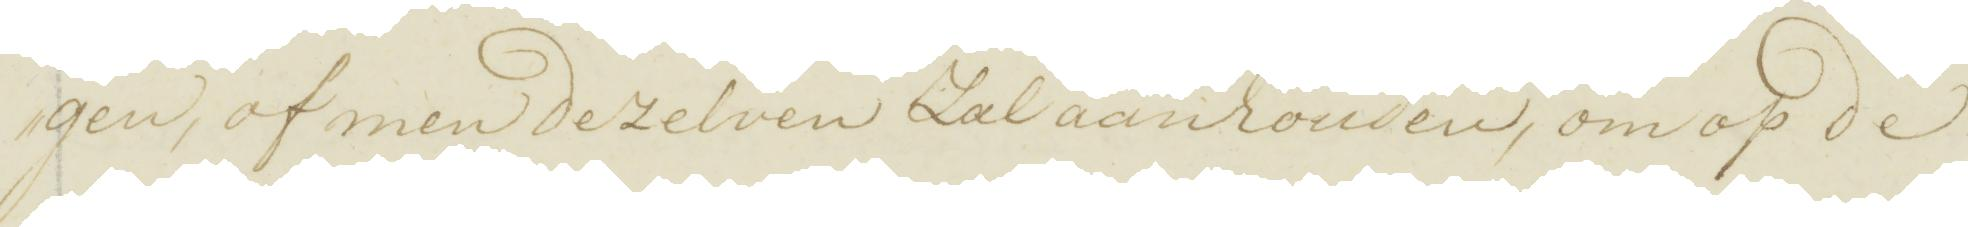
„gen, of men dezelven zal aanhouden, om op de
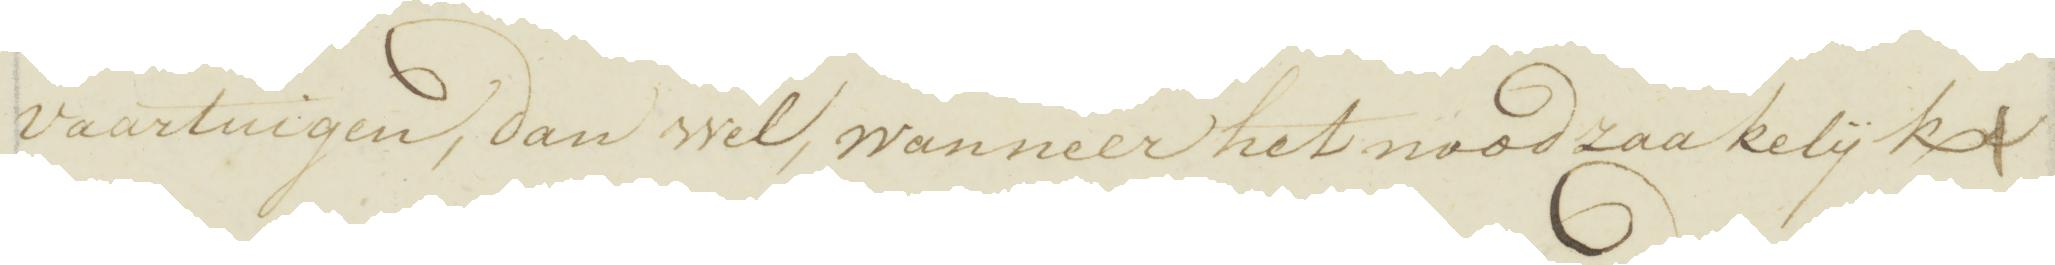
vaartuigen, dan wel, wanneer het noodzaakelijkst
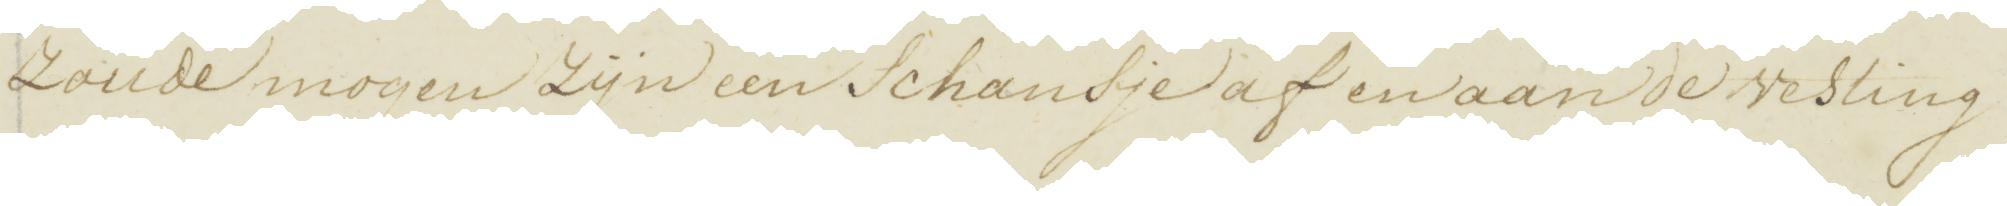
zoude mogen zijn een schansje of en aarde vesting
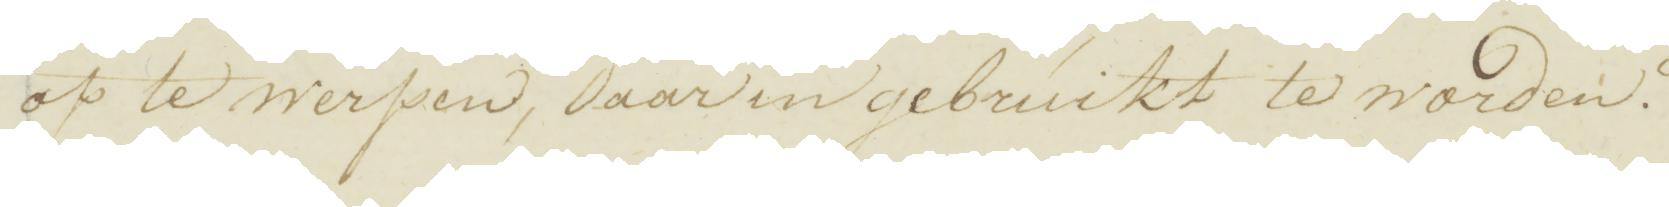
op te werpen, daar in gebruikt te worden?
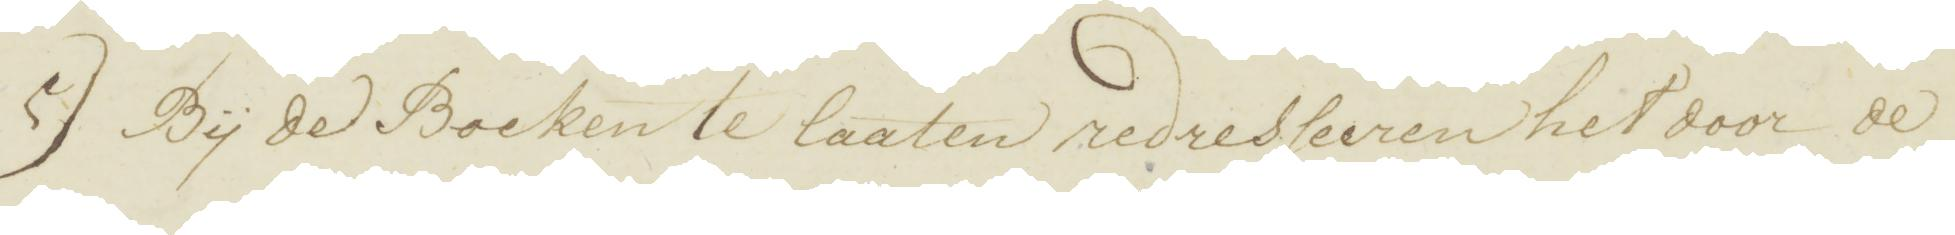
5) Bij de Boeken te laaten redresseeren het door de
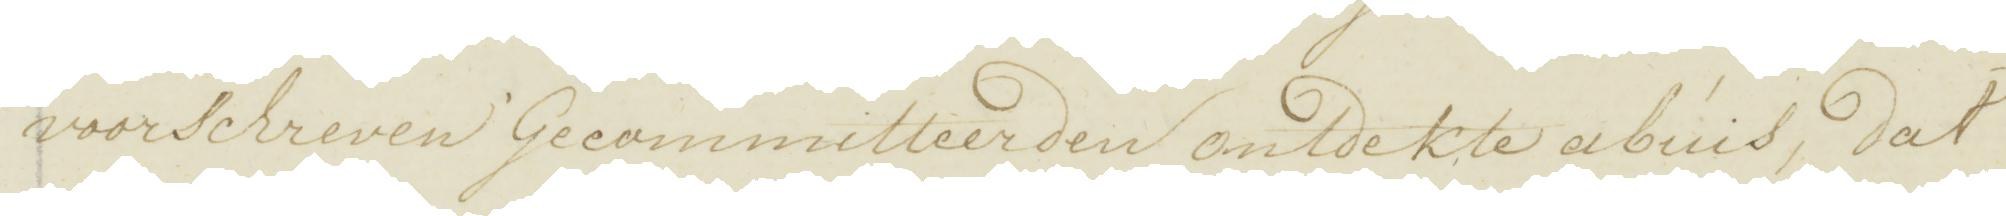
voorschreven Gecommitteerden ontdekte abuis, dat
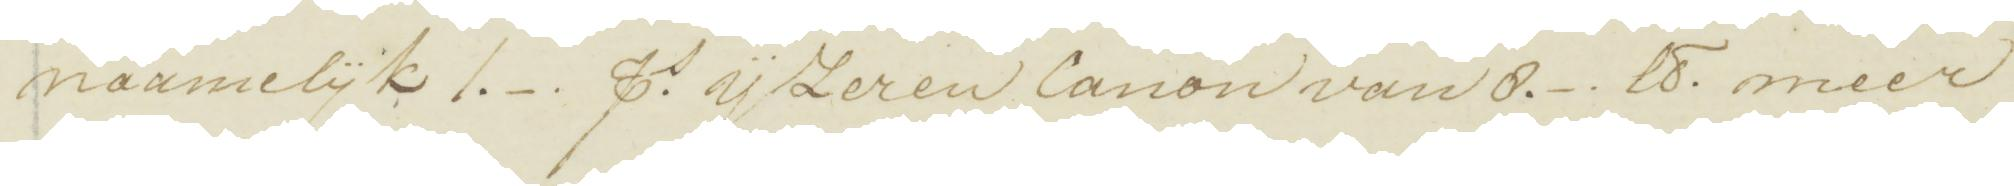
naamelijk 1.–. p.s ijzeren canon van 8.–. lb. meer
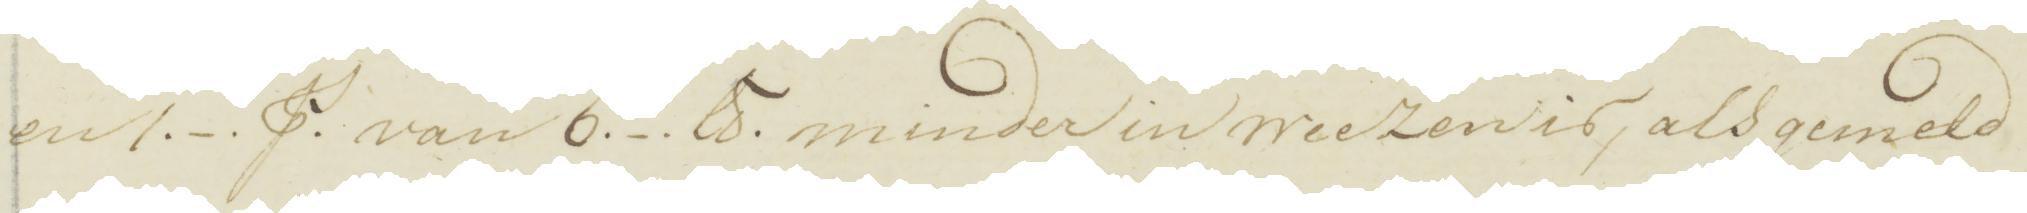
en 1.–. p:s van 6.–. lb. minder in weezen is, als gemeld,
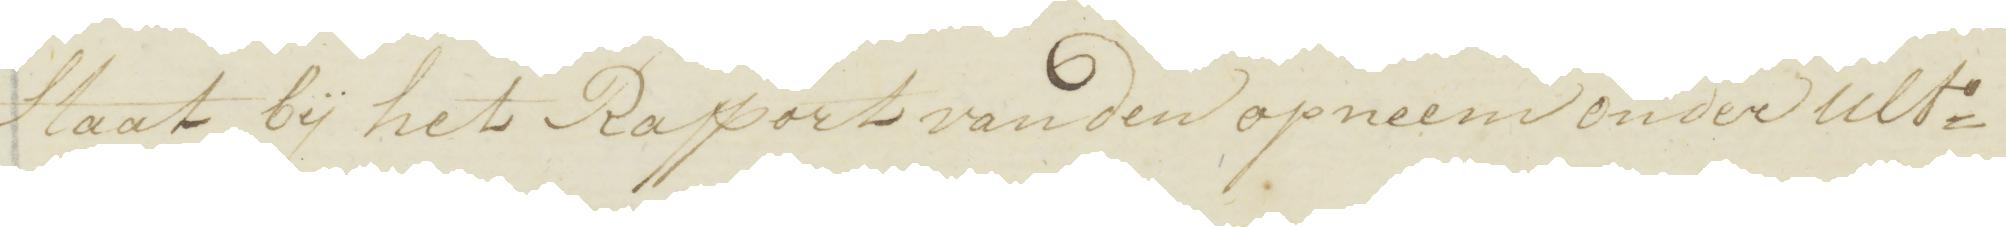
staat bij het Rapport van den opneem onder ult=o
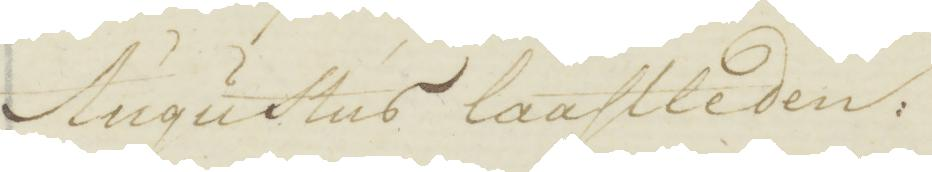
Augustus laastleden.
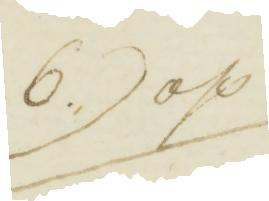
6) op
